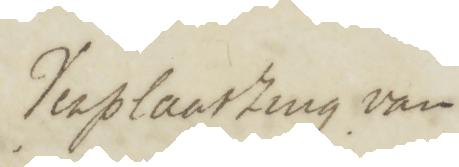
Verplaatzing van
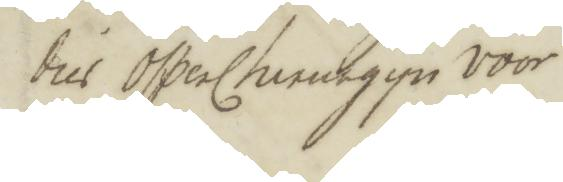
dier opperchirurgijn voor
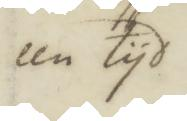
een tijd
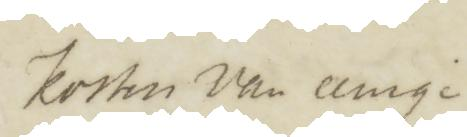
kosten van eenige
